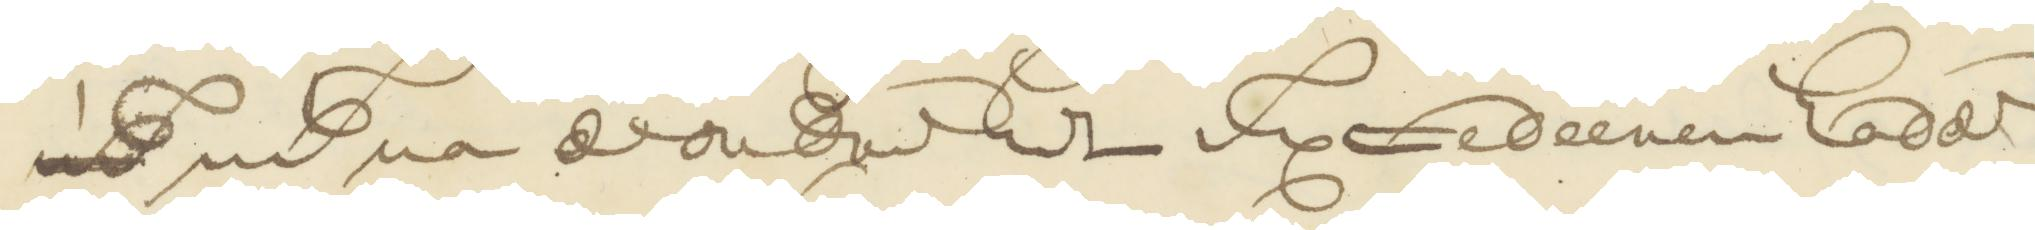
'T uE na de ordre het Excedeeren hadde
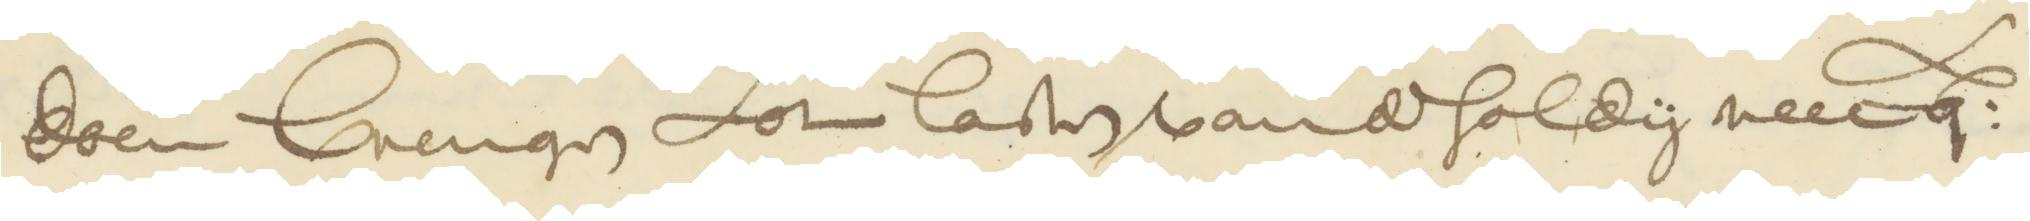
doen brengen Tot lasten van de soldij reecq:
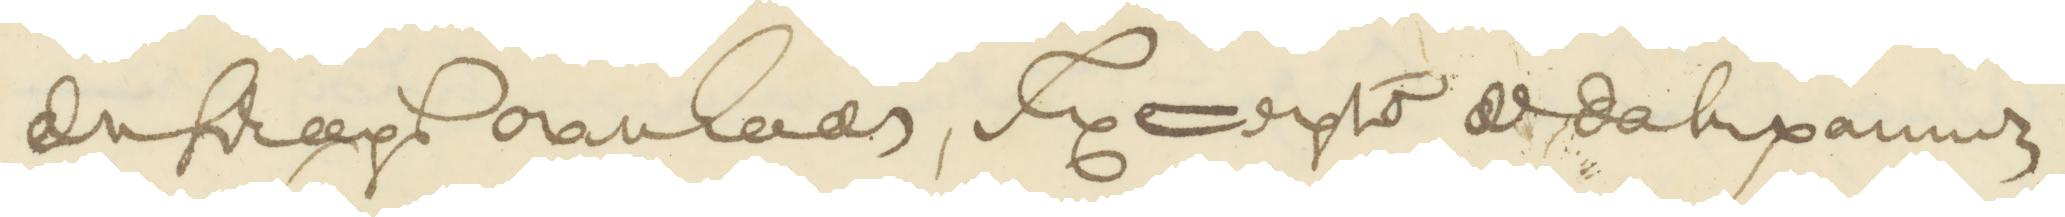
der scheeps overheeden, Excepte de dakpannen,
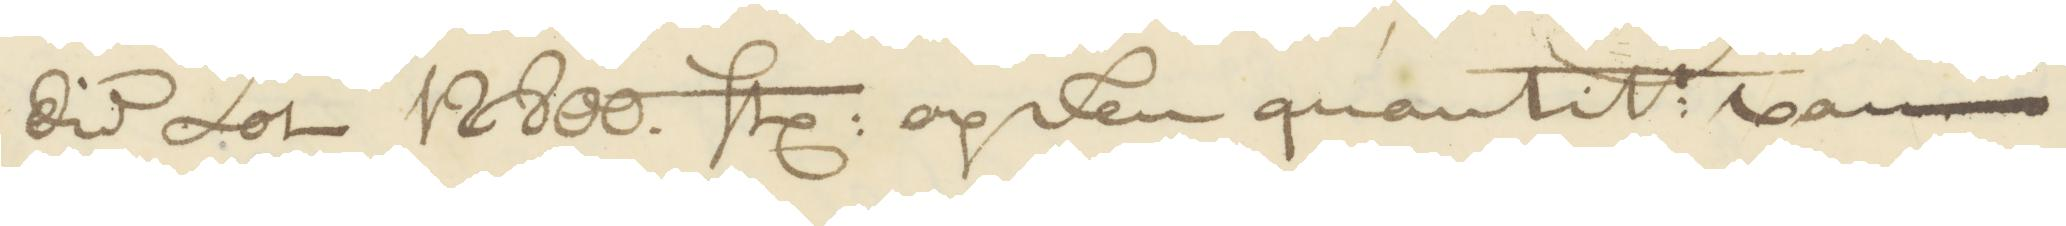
die tot 12800. stx: op Een quantit:t van
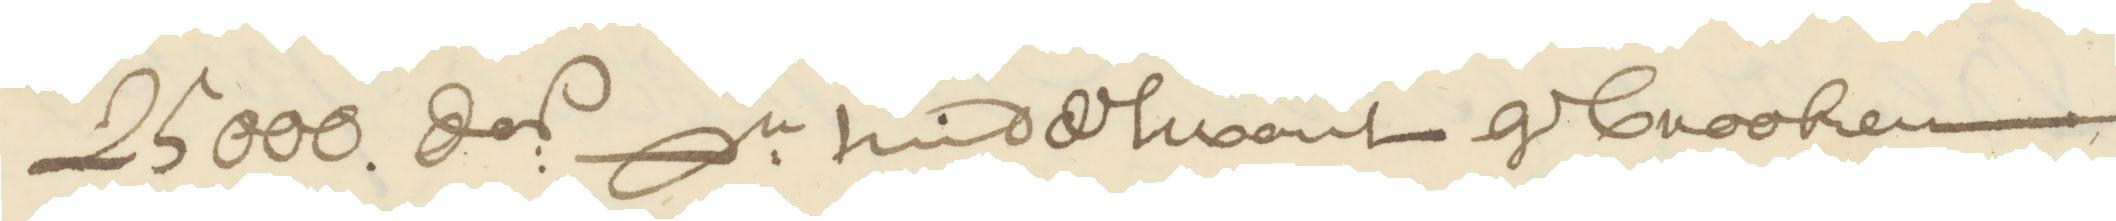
25000. d:os p:r t middelwout gebrooken
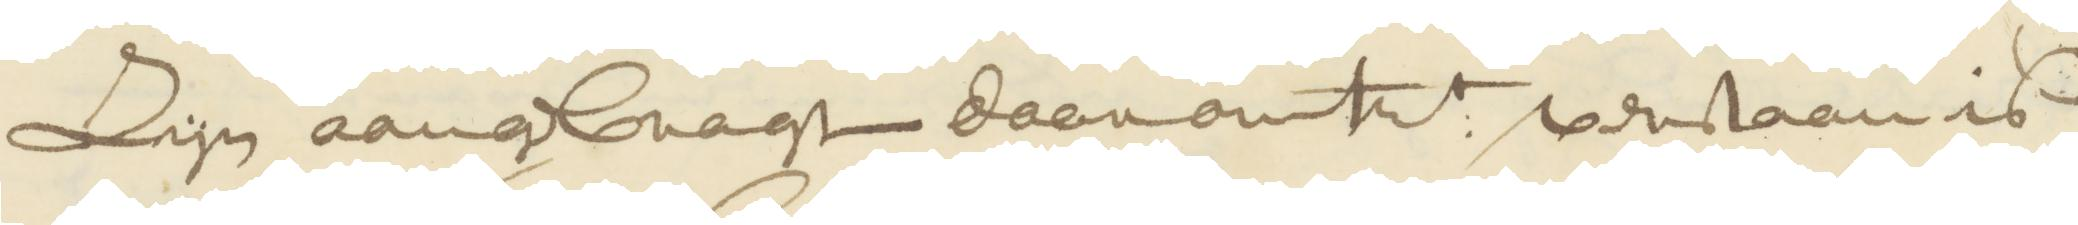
Zijn aangebragt daaromtr:t verstaan is
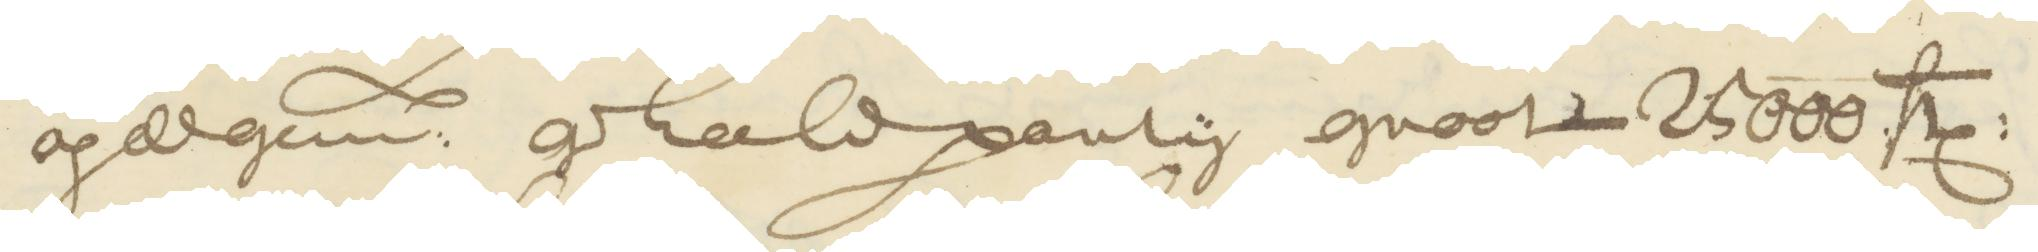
op de gem: geheele partij groot 25000 stx:
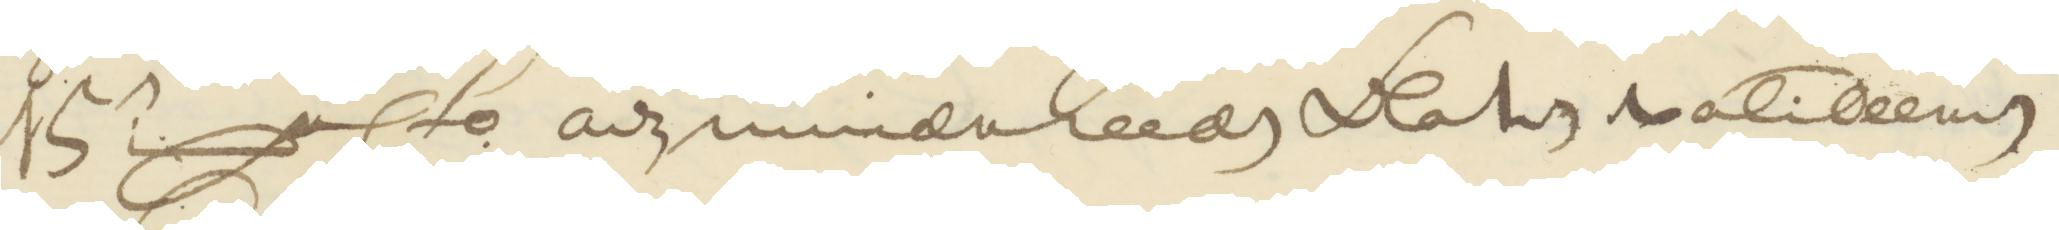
15' pr cto: aen minderheeden te laten valideeren
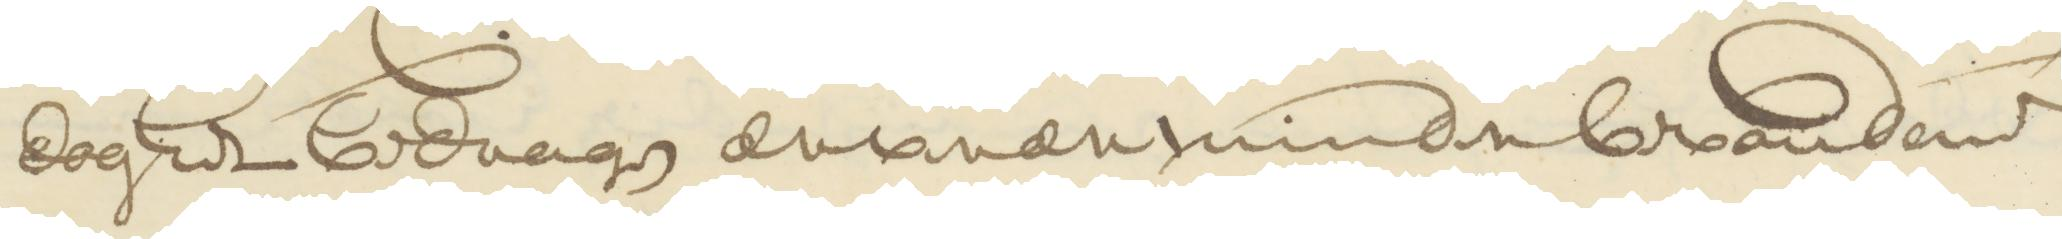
dog het bedragen der verder minder bevondene
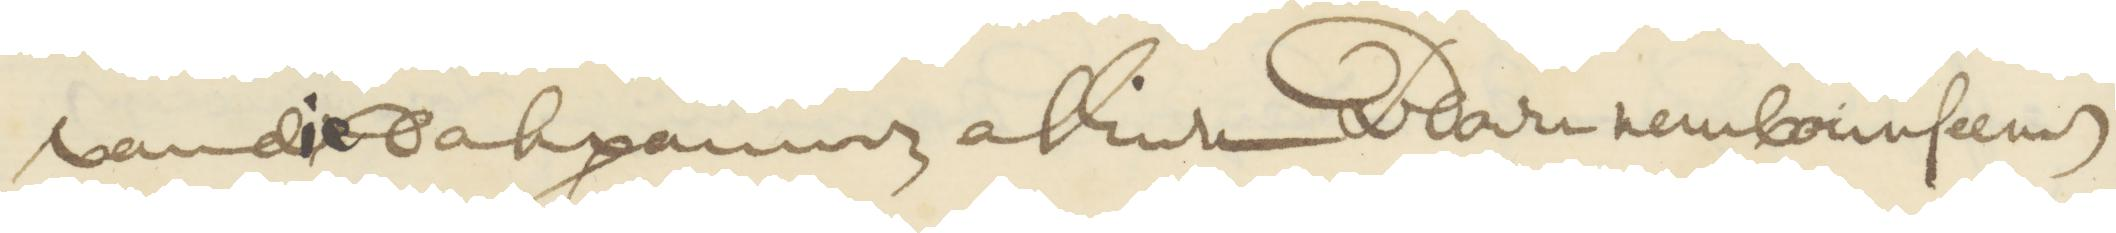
van die dakpannen alhier te doen rembourseeren
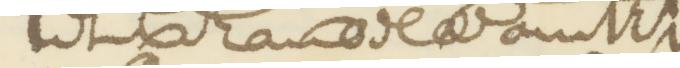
het behandelde omtr:t
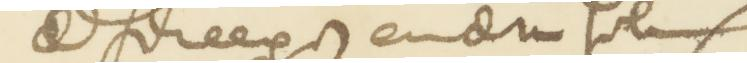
de scheepen en der sel
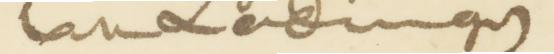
ver ladingen
